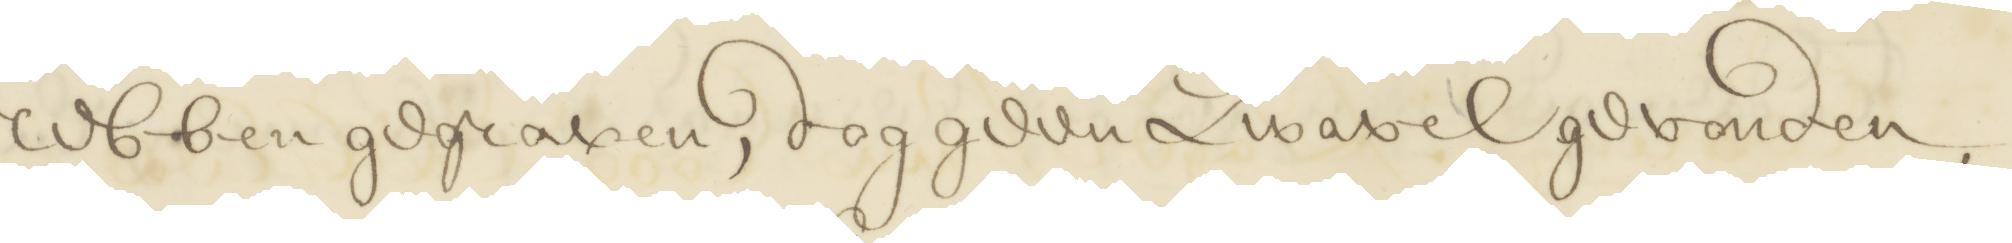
hebben gegraven, dog geen Zwavel gevonden,
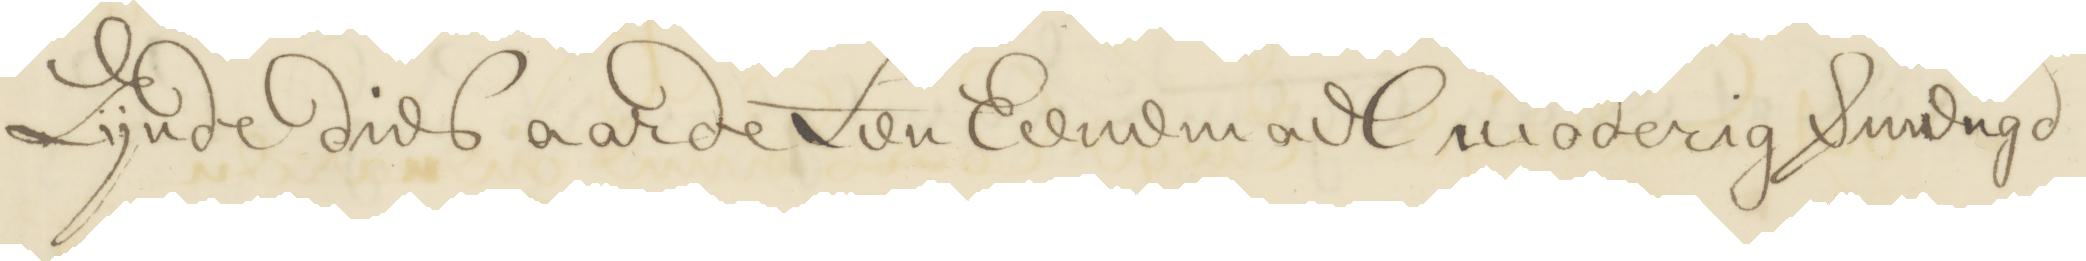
Zijnde dies aarde ten Eenemael moderig vermengd
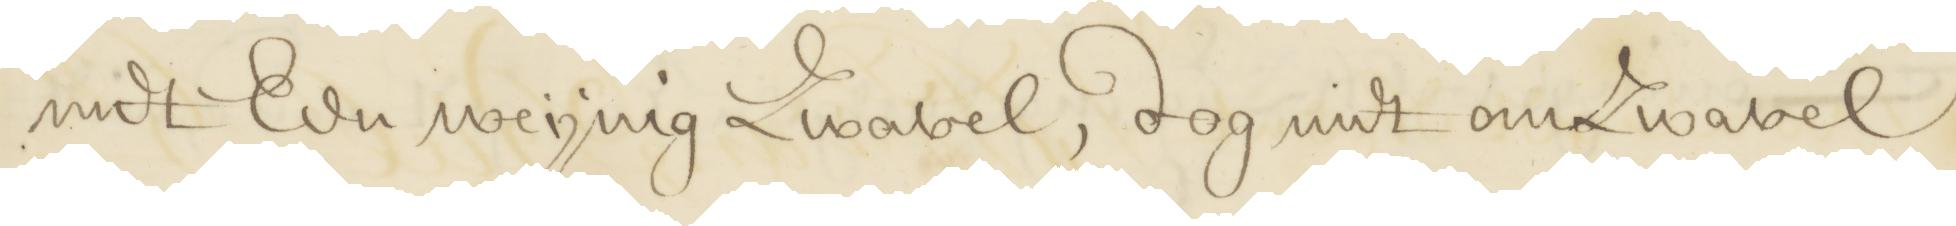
met Een weijnig Zwavel, dog niet om Zwavel
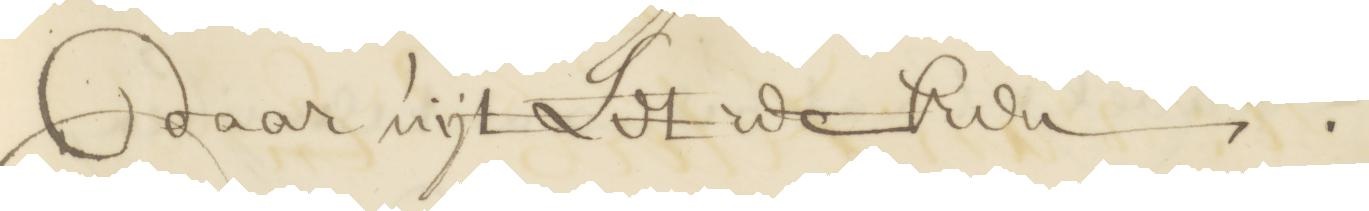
daar uijt tetrecken.
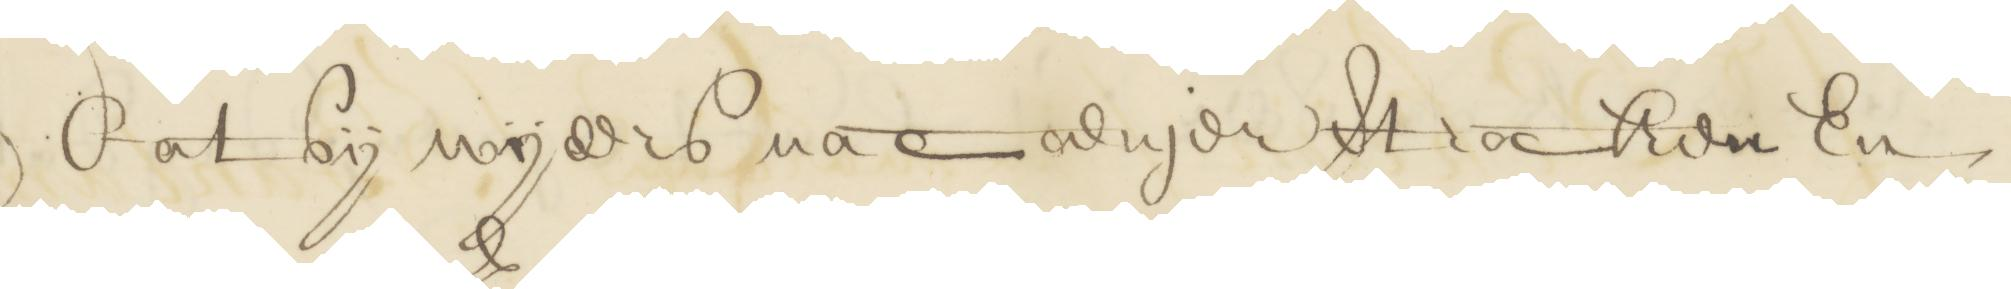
dat bij wijders na coenjer vertrocken En
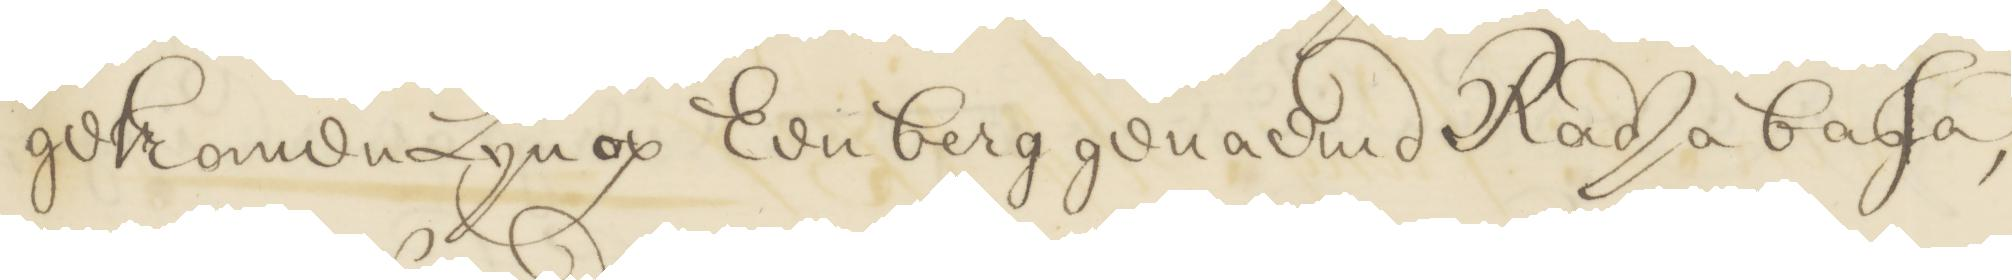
gekomen Zyn op Een berg genaemd Radja bassa,
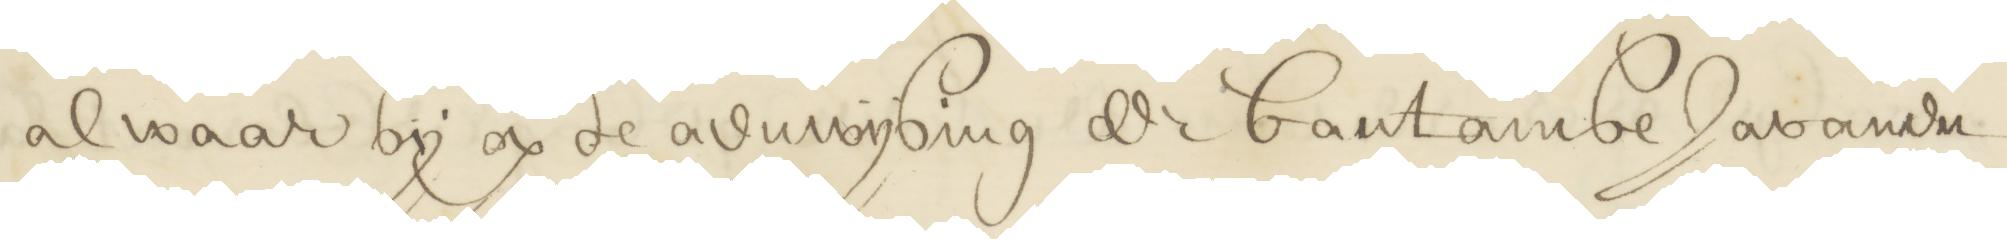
alwaar bij op de aenwijsing der bantamse Javanen
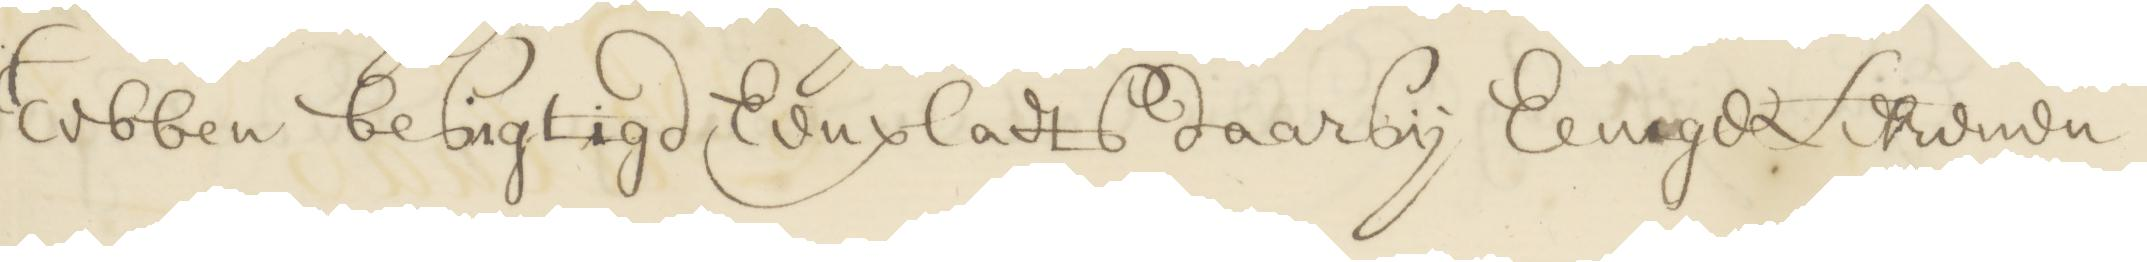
hebben besigtigd Een plaets daar bij Eenige tekenen
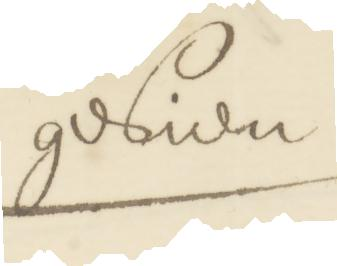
gesien
